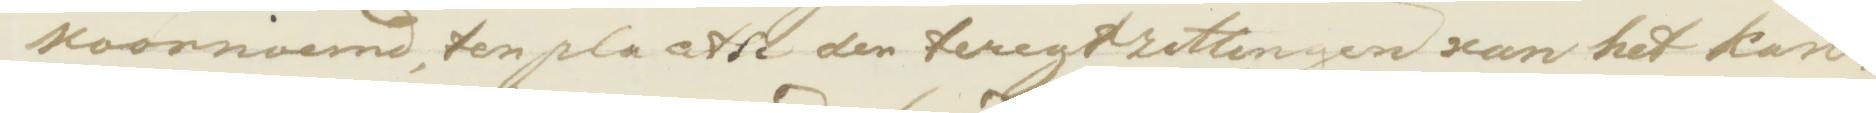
voornoemd, ten plaatse der teregtzittingen van het kan„
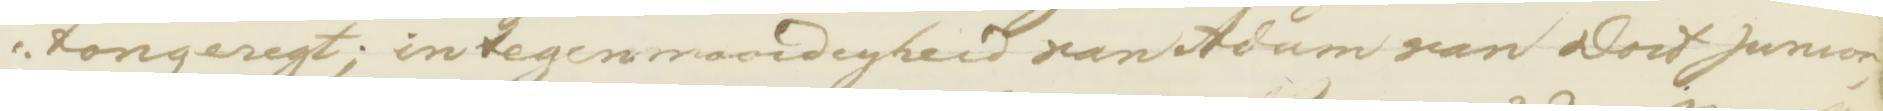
„tongeregt; in tegenwoordigheid van Adam van Dort Junior,
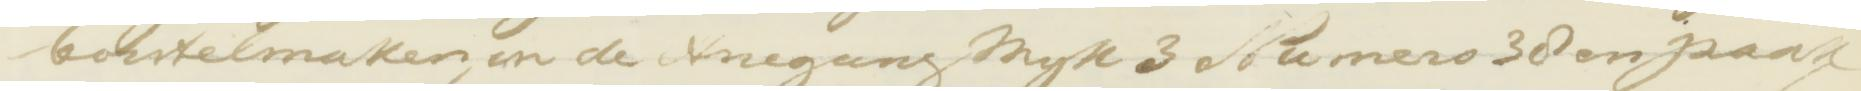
borstelmaker, in de Anegang Wyk 3 Numero 38 en Izaak
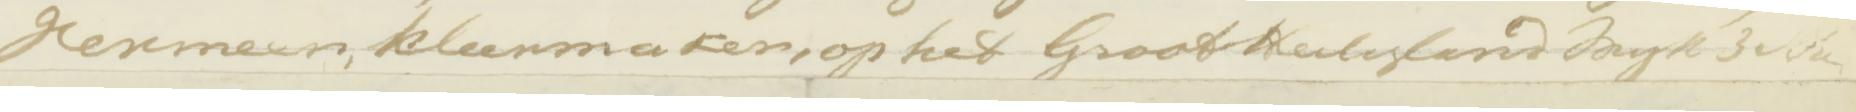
Vermeer, kleermaker, op het Groot Heiligland wyk 3 Nu
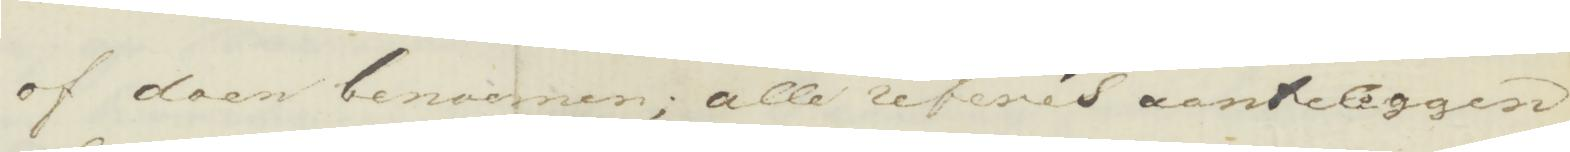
of doen benoemen; alle referés aan te leggen
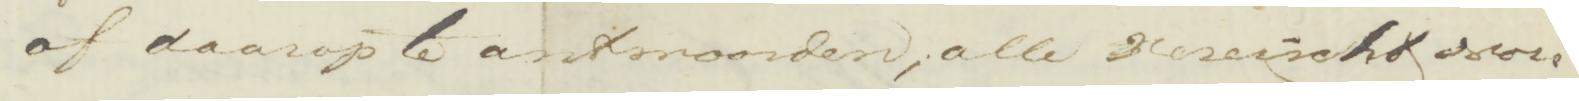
of daarop te antwoorden, alle vereischt wor
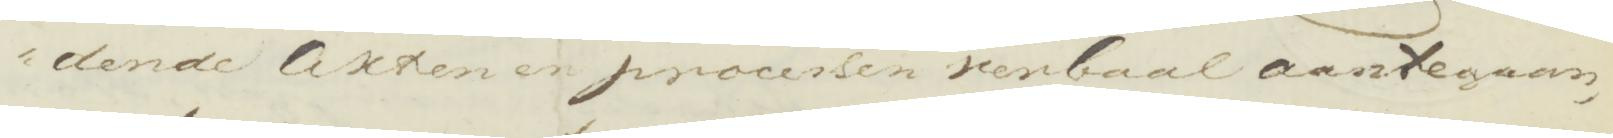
„dende Akten en processen verbaal aan te gaan,
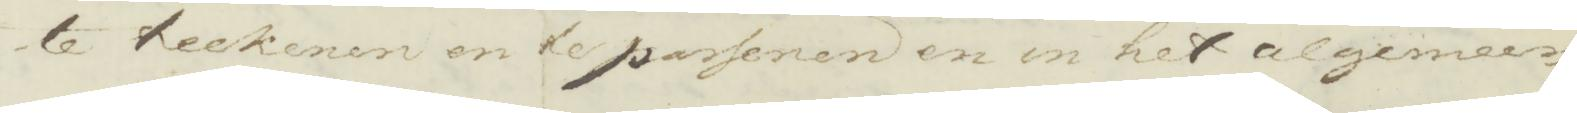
„te teekenen en te passeren en in het algemeen
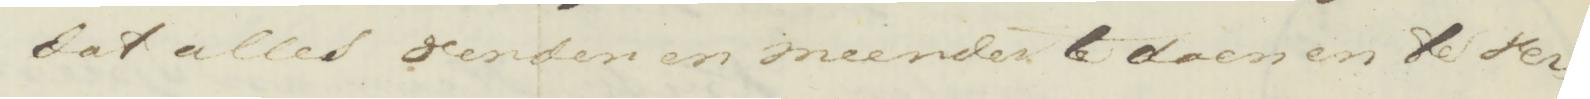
dat alles verder en meerder te doen en te Ver
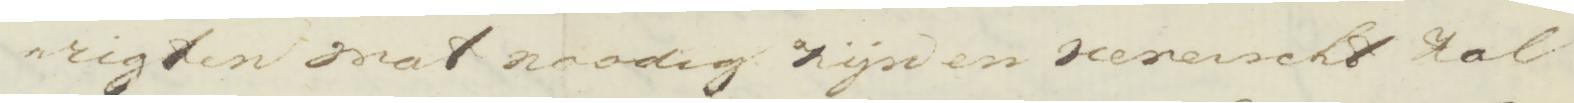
„rigten wat noodig zijn en vereischt zal
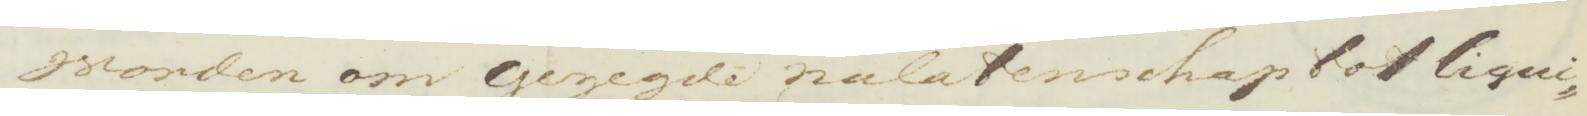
worden om gezegde nalatenschap tot liqui„
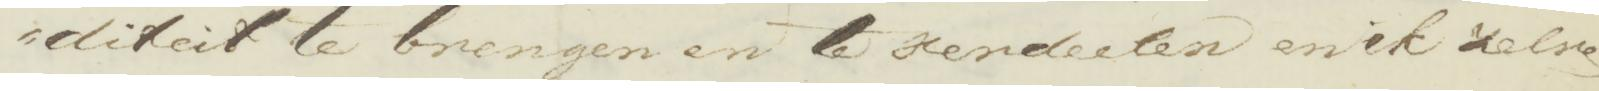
„diteit te brengen en te verdeelen en ik zelve
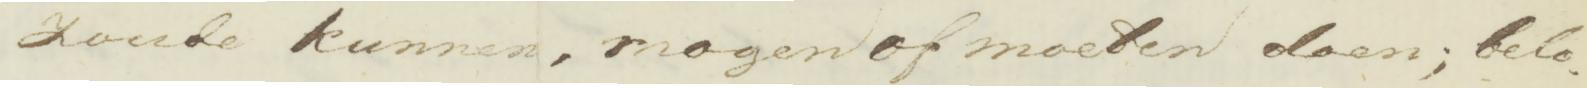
zoude kunnen, mogen of moeten doen; belo„
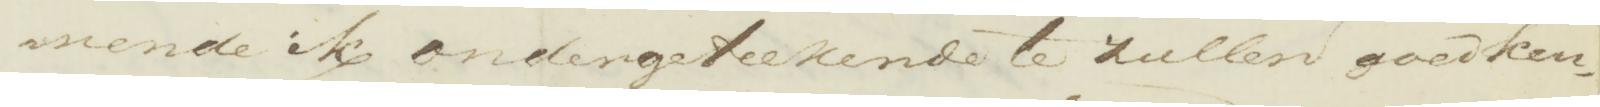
vende ik ondergeteekende te zullen goedkeu„
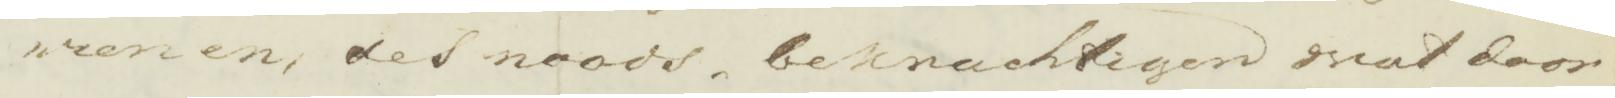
„ren en, des noods bekrachtigen wat door
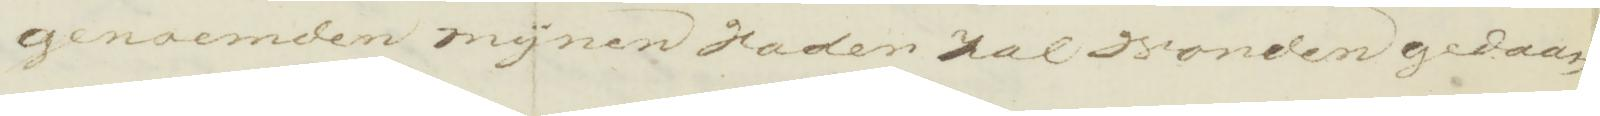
genoemden mijnen Vader zal worden gedaan
